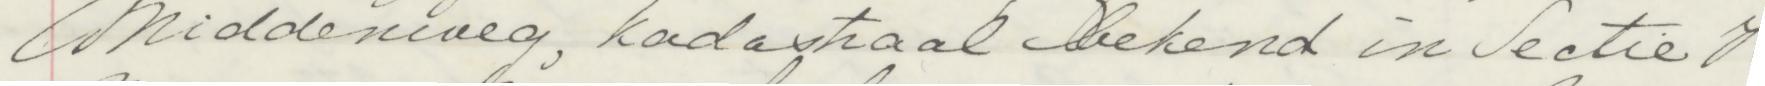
Middenweg, kadastraal bekend in sectie H
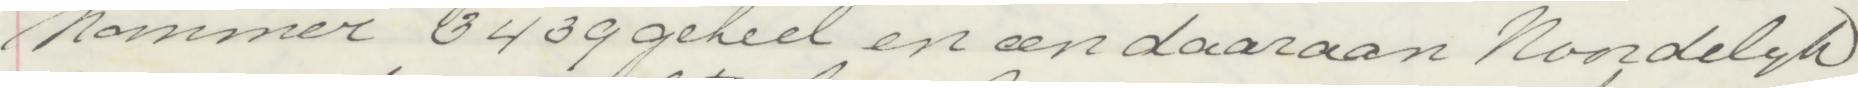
Nommer 3439 geheel en een daaraan Noordelyk
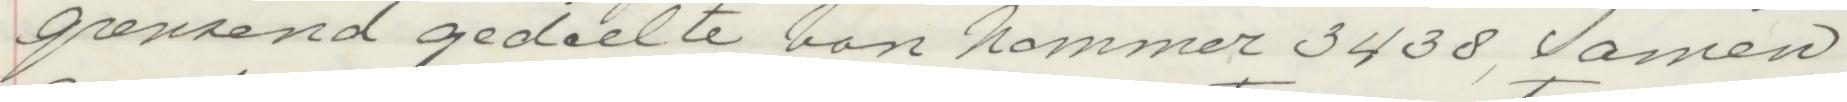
grenzend gedeelte van Nommer 3438, samen
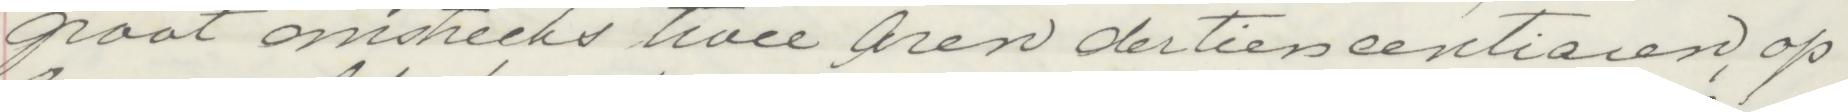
groot omstreeks twee Aren dertien centiaren, op
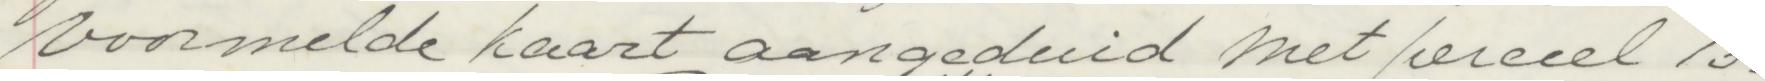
voormelde kaart aangeduid met perceel 13-
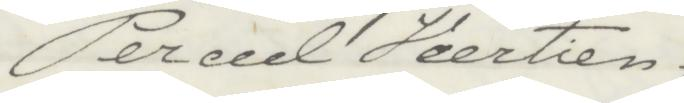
Perceel Veertien
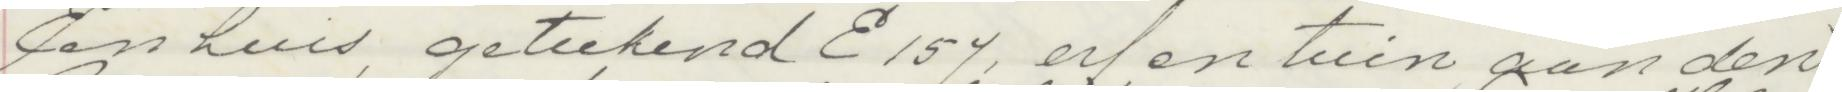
Een huis, geteekend E 157, erf en tuin, aan den
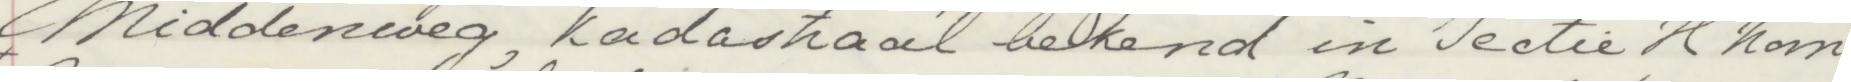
Middenweg, kadastraal bekend in sectie H nom
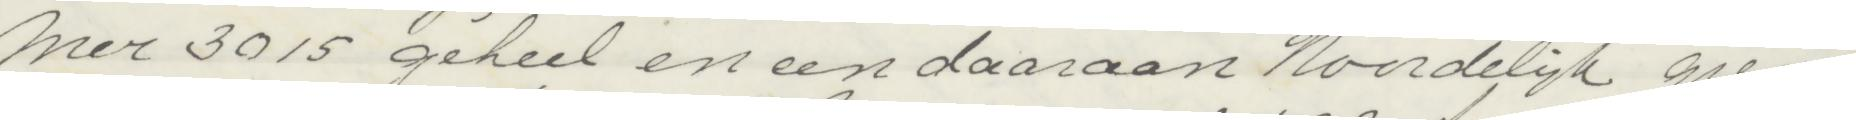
mer 3015 geheel en een daaraan Noordelijk gren-
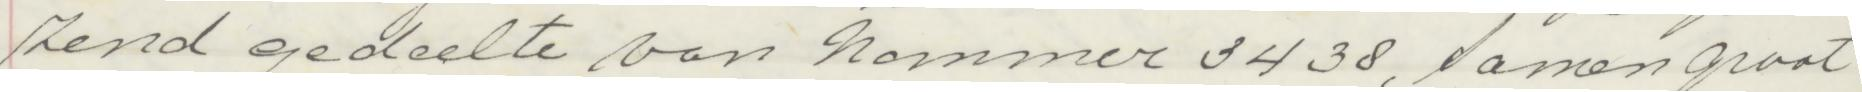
zend gedeelte van Nommer 3438, samen groot
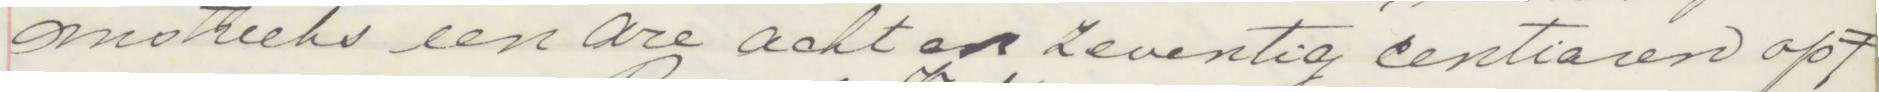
omstreeks een Are acht en zeventig centiaren op ¶
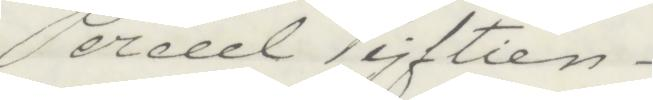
Perceel Vijftien
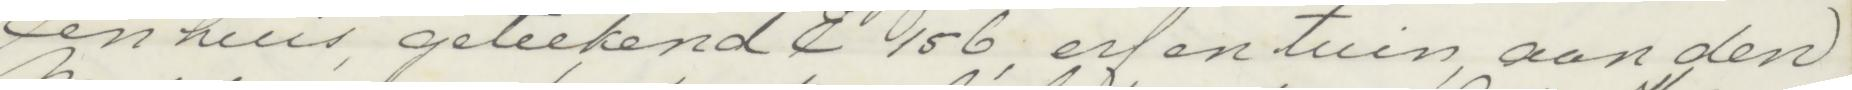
Een huis, geteekend E 156, erf en tuin, aan den
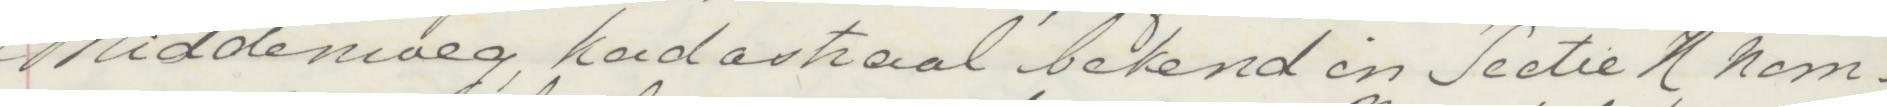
Middenweg, kadastraal bekend in Sectie H nom-
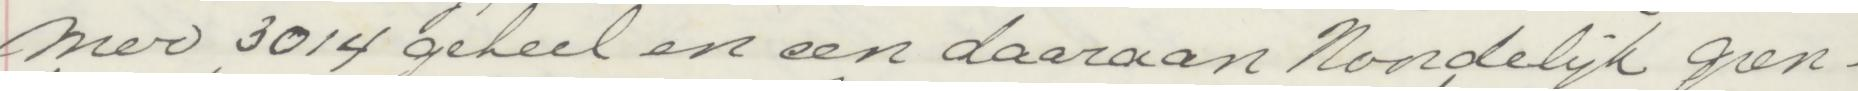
mer 3014 geheel en een daaraan Noordelijk gren-
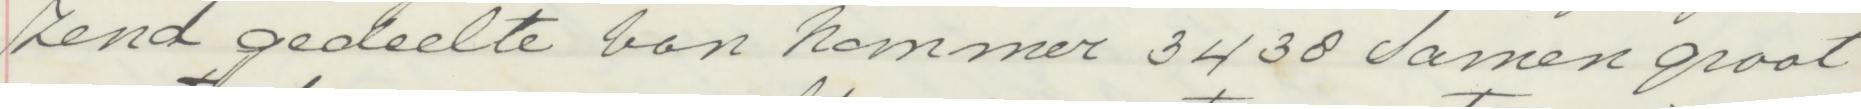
zend gedeelte van Nommer 3438 samen groot
